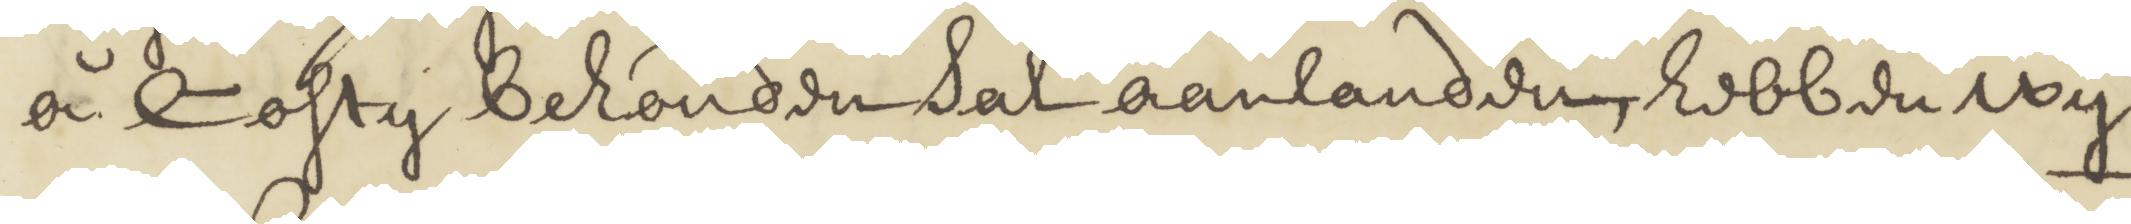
de Costij behouden sal aanlanden, hebben wij
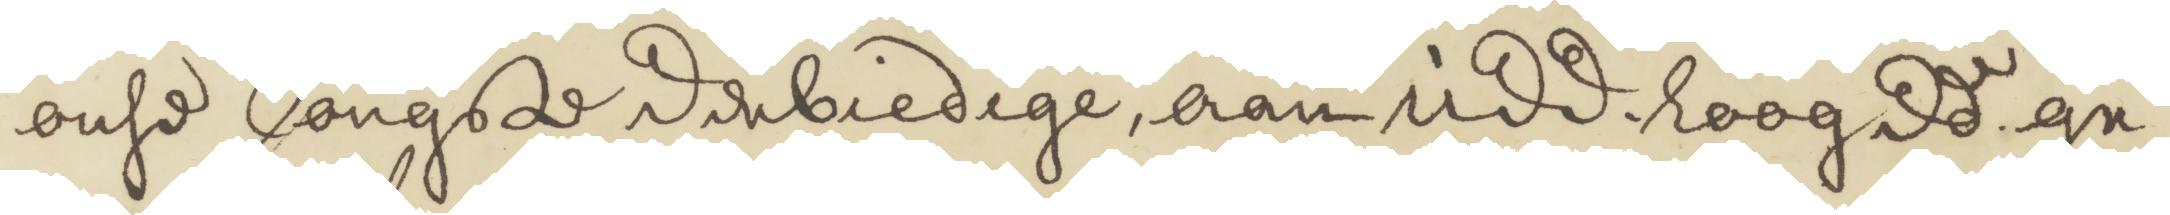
onse Jongste Eerbiedige, aan uEE. hoog Ed.e gr
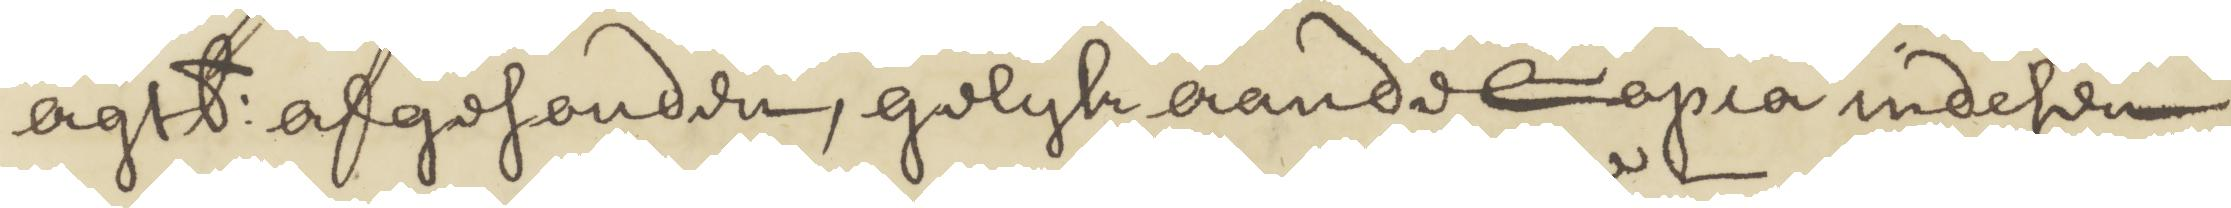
agtb: afgesonden, gelyk aande Copia indesen
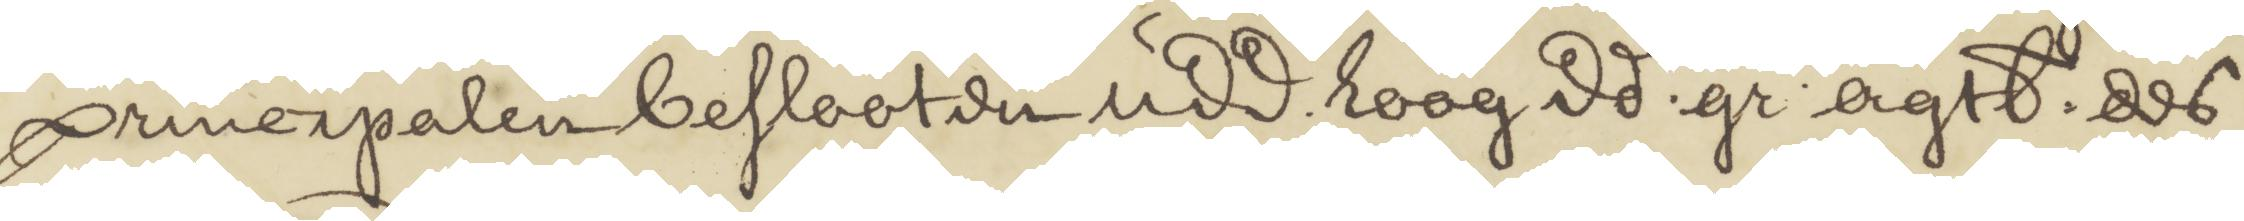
principalen beslooten uEE. hoog Ed:e gr. agtb: des
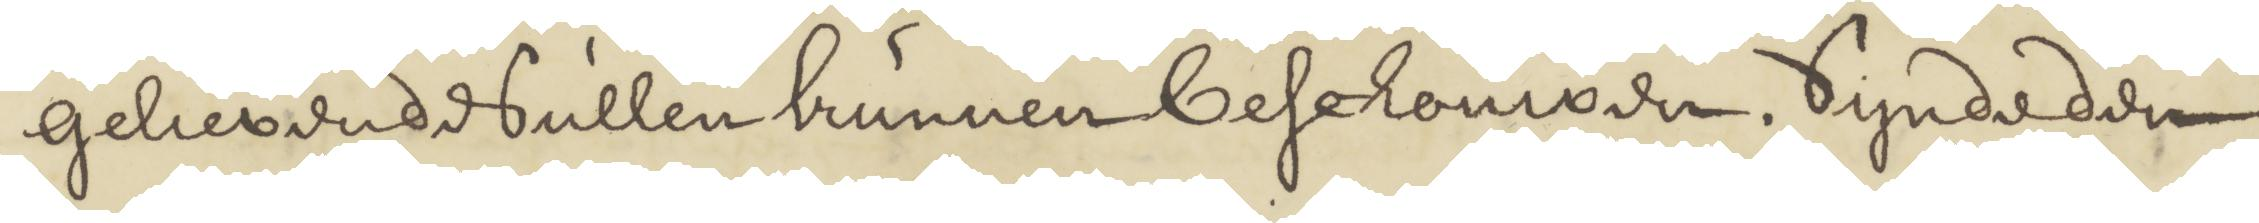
gelievende sullen kunnen beschouwen. sijnde den
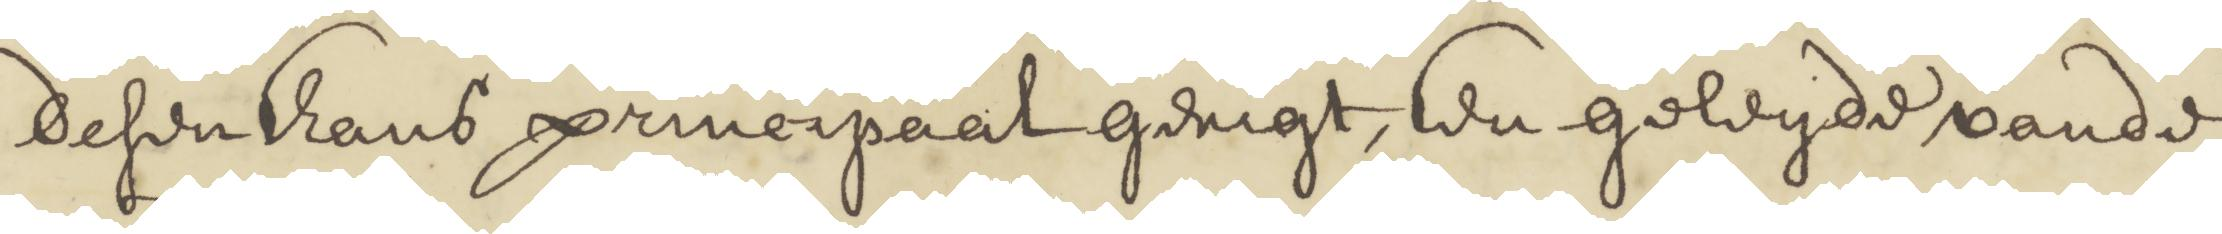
desen thans principaal gerigt, ten geleijde vande
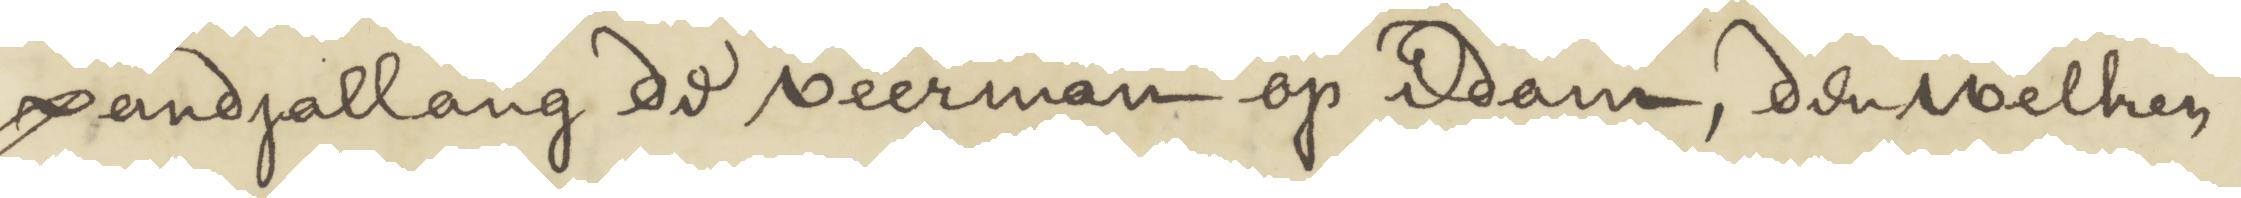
pandjallang de veerman op Edam, den welken
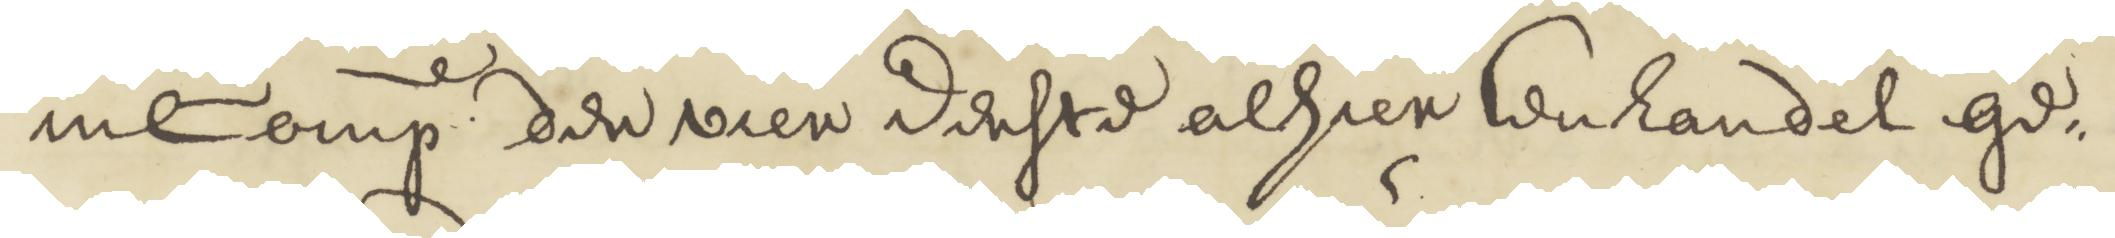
in Comp:e der vier Eerste alhier ten handel ge„
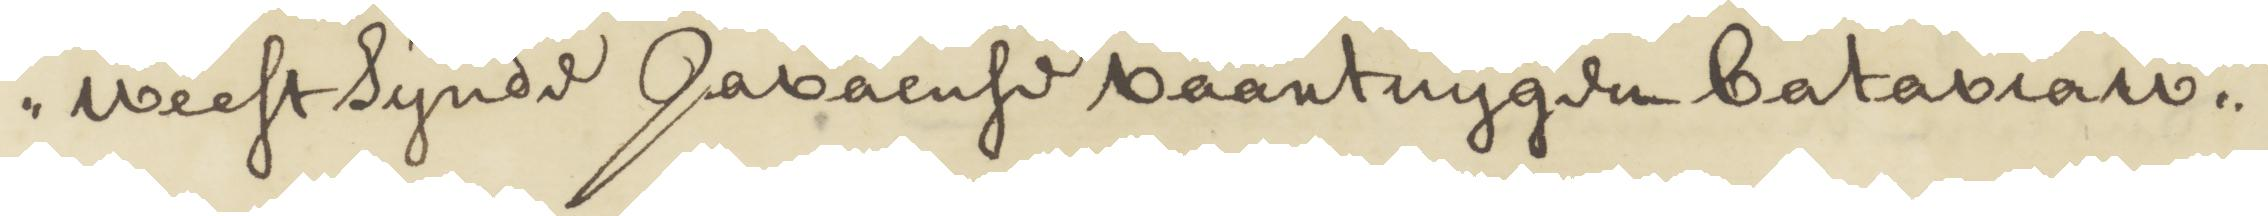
„weest synde Javaense vaartuijgen batavia w„ts
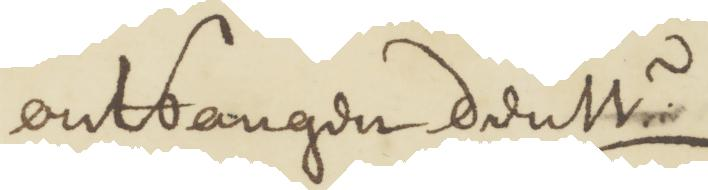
ontfangen den 11:'
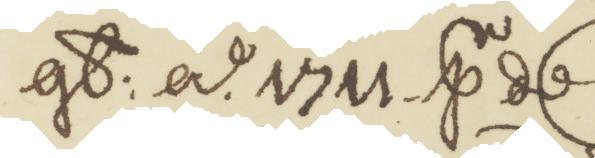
9b: a.o 1711. pr de
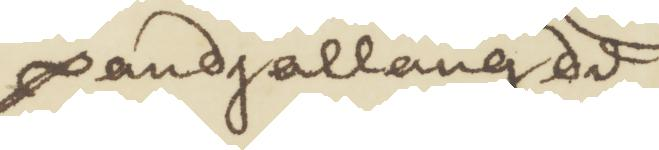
pandjallang de
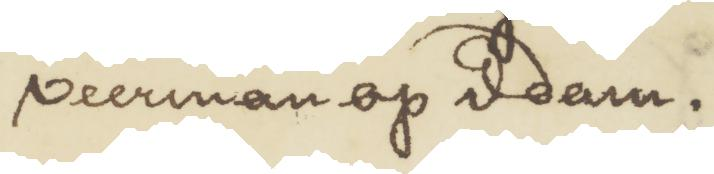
veerman op Edam.
